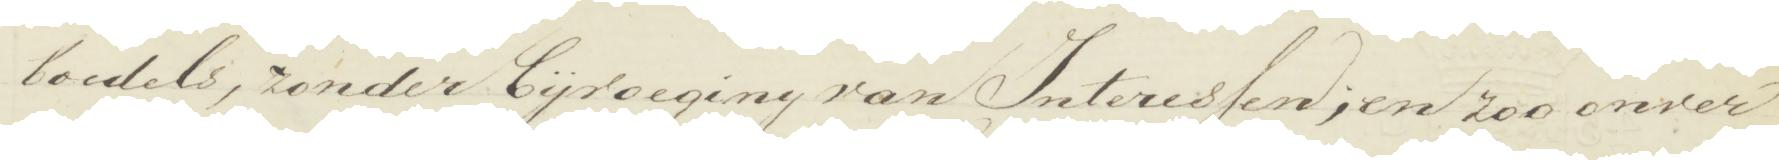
boedels, zonder bijvoeging van Interessen; en zoo onver
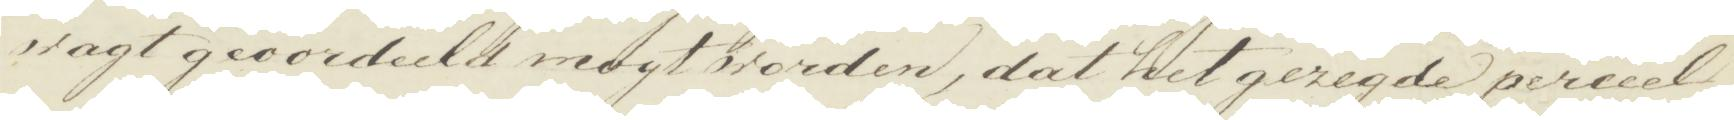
wagt geoordeelt mogt worden, dat het gezegde perceel
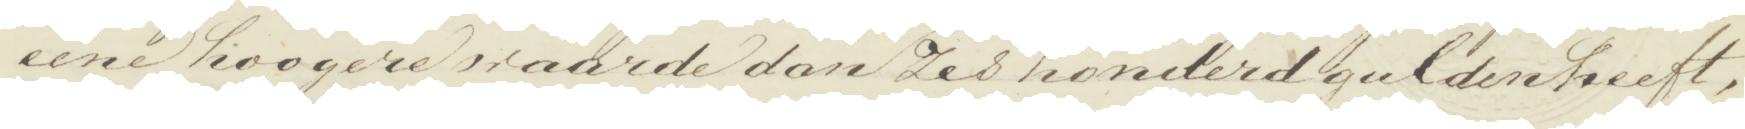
eene hoogere waarde dan zes honderd gulden heeft,
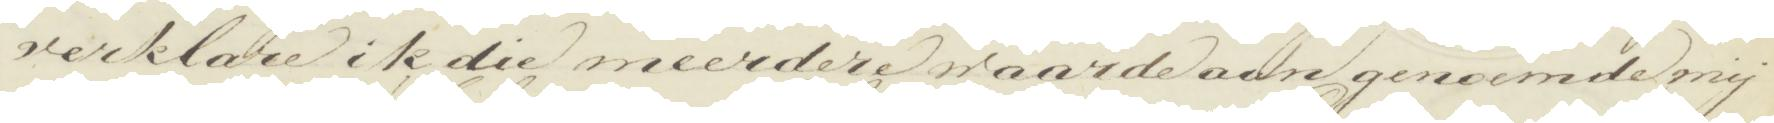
verklare ik die meerdere waarde aan genoemde mij
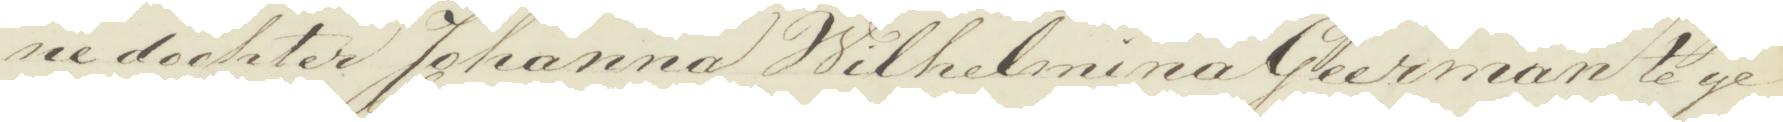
ne dochter Johanna Wilhelmina Geerman te ge
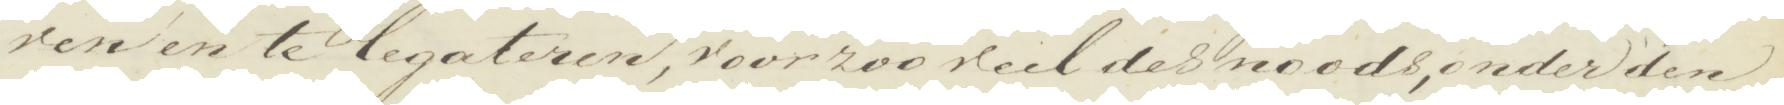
ven en te legateren, voor zoo veel des noods, onder den
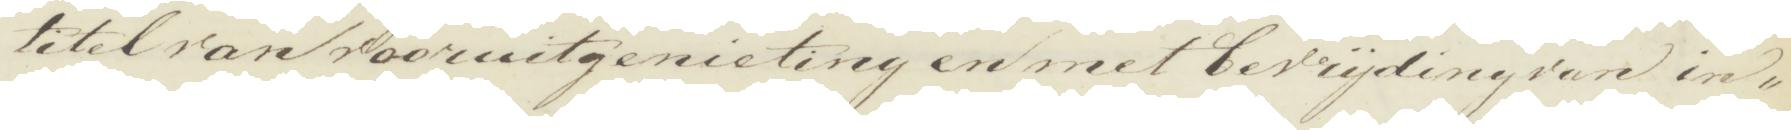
titel van vooruitgenieting en met bevrijding van in„
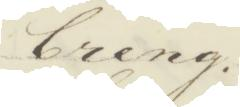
breng.
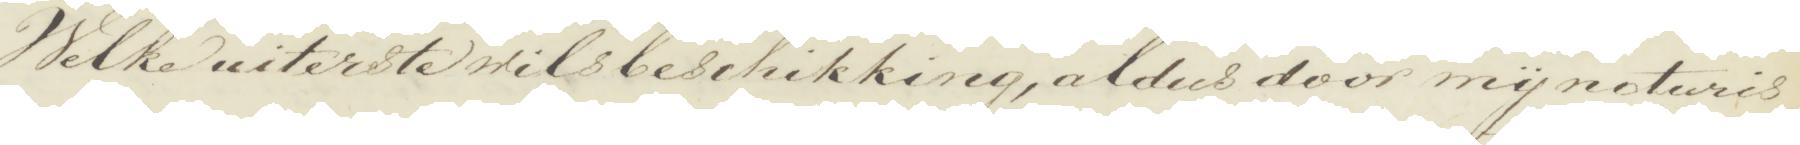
Welke uiterste wils beschikking, aldus door mij notaris
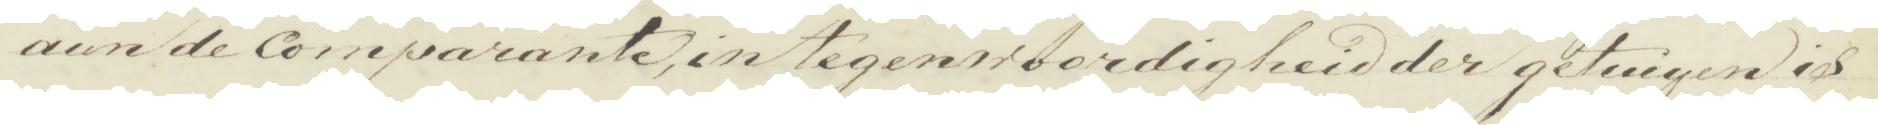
aan de comparante, in tegenwoordigheid der getuigen is
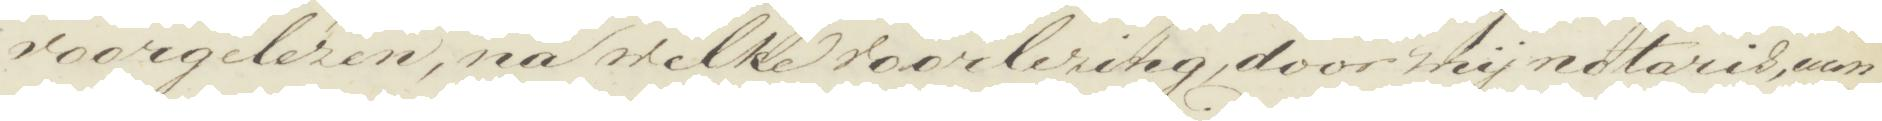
voorgelezen, na welke voorlezing, door mij notaris, aan
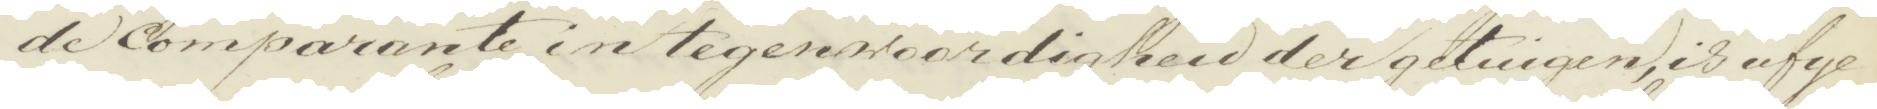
de Comparante in tegenwoordigheid der getuigen, is afge
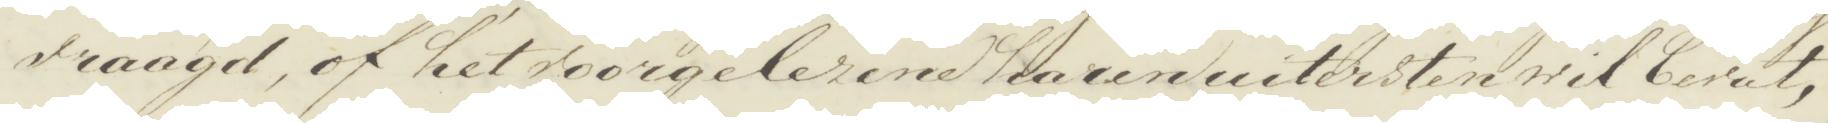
vraagd, of het voorgelezene haren uitersten wil bevat,
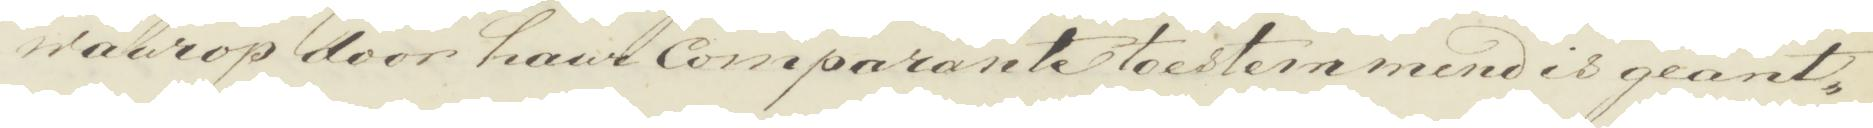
waarop door haar Comparante toestemmend is geant„
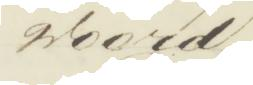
woord
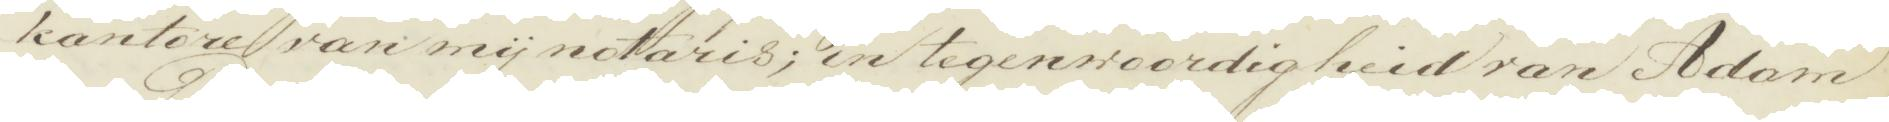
kantore van mij notaris; in tegenwoordigheid van Adam
